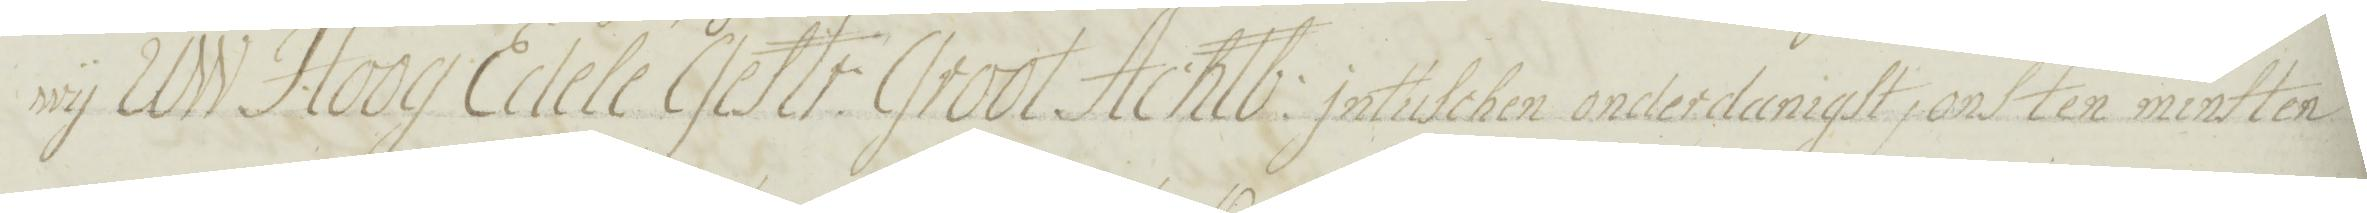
wij uw Hoog Edele Gestr: Groot Achtb: Jntuschen onderdanigst, ons ten minsten
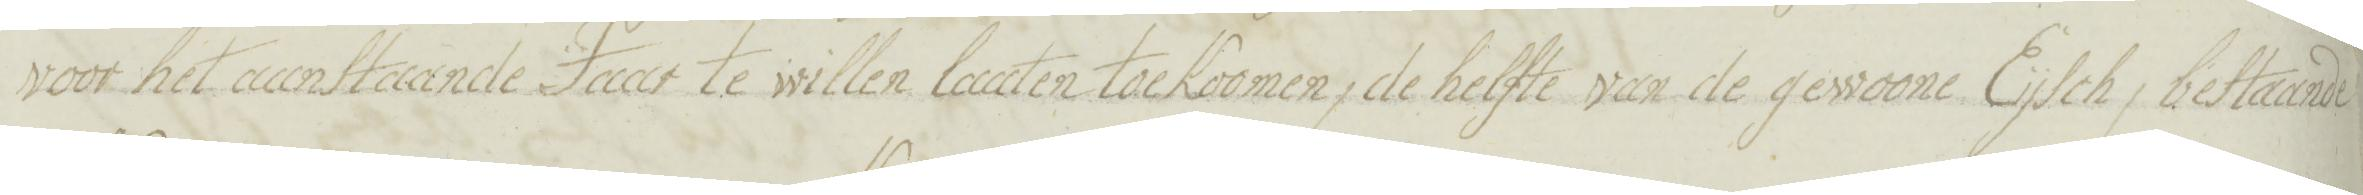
voor het aanstaande Iaar te willen laaten toekoomen, de helfte van de gewoone Eijsch, bestaande
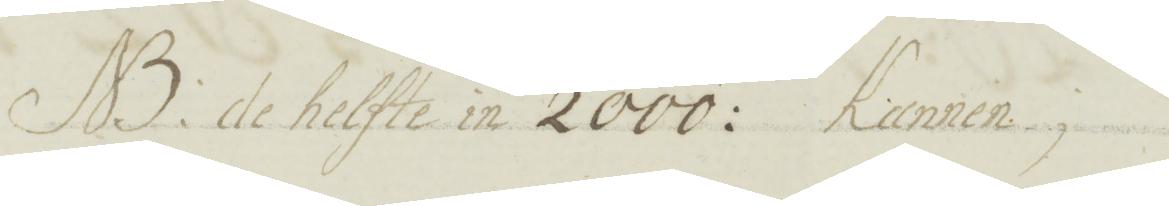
NB: de helfte in 2000: Kannen.,
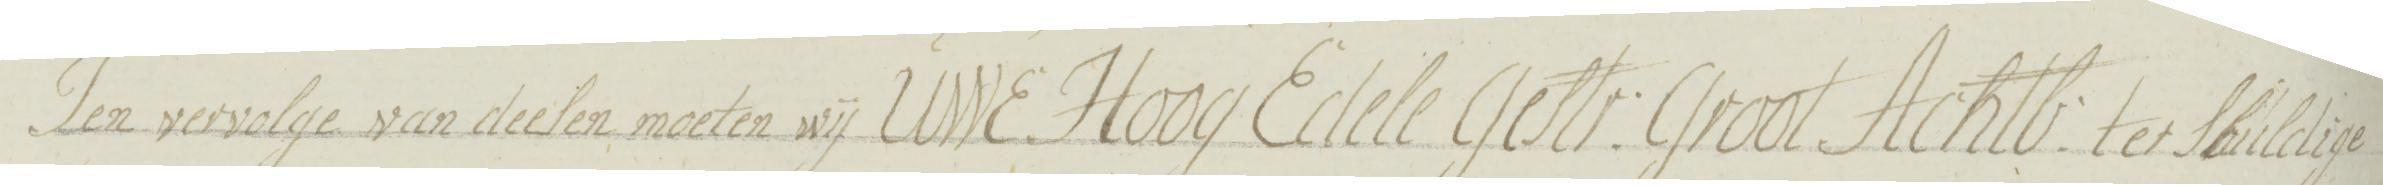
Ten vervolge van deesen moeten wij UWE Hoog Edele Gestr: Groot Achtb: ter Schuldige
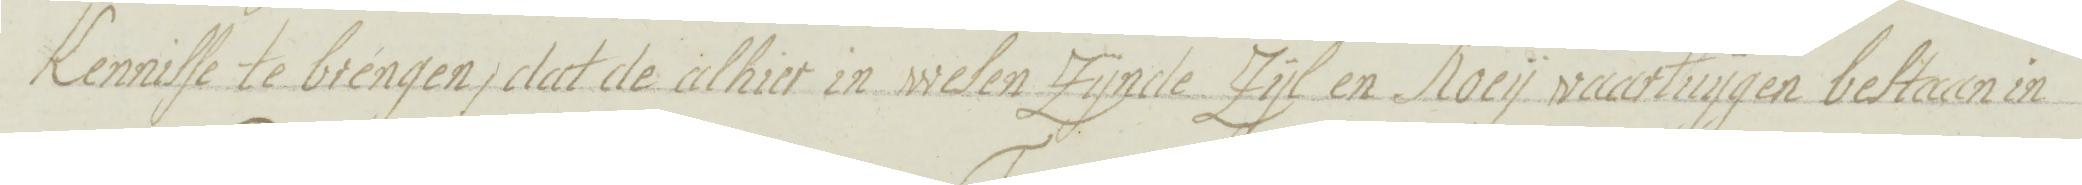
Kennisse te brengen, dat de alhier in wesen zijnde Zijl en Roeij vaartuijgen bestaan in
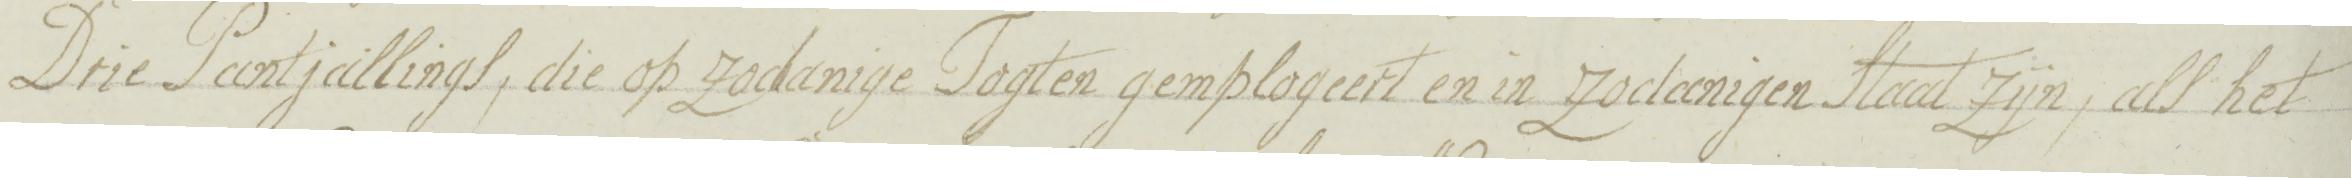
Drie Pantjallings, die op zodanige Togten gemployeert en in zodanigen staat zijn, als het
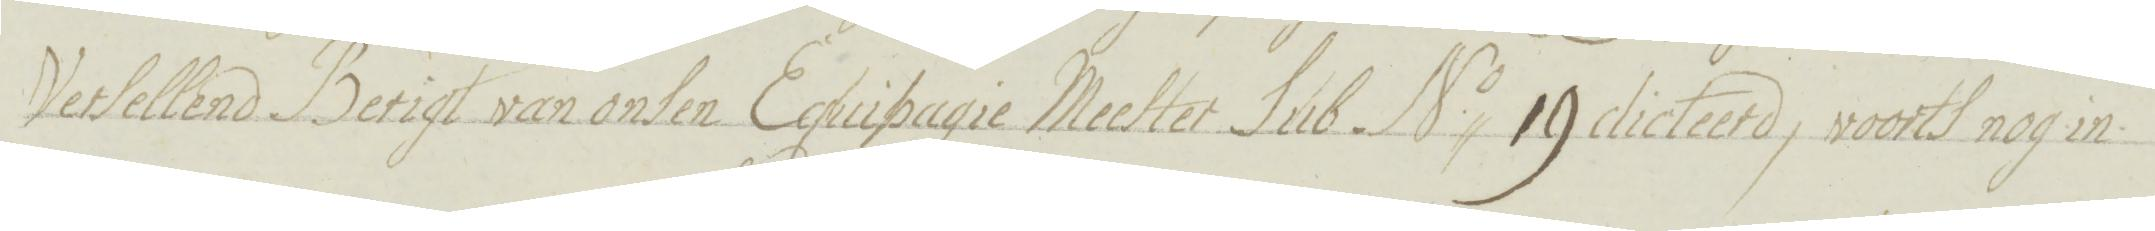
Versellend Berigt van onsen Equipagie Meester Sub N„o 19 dicteerd, woorts nog in.
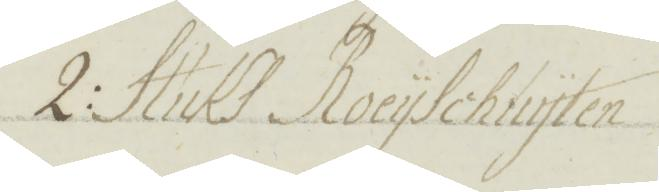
2: Stuks Roeijschuijten
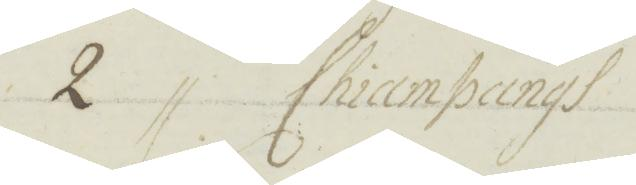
2„ Chiampangs
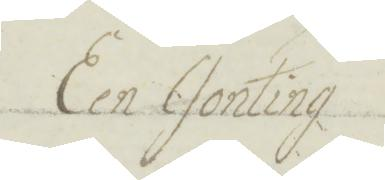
Een Gonting
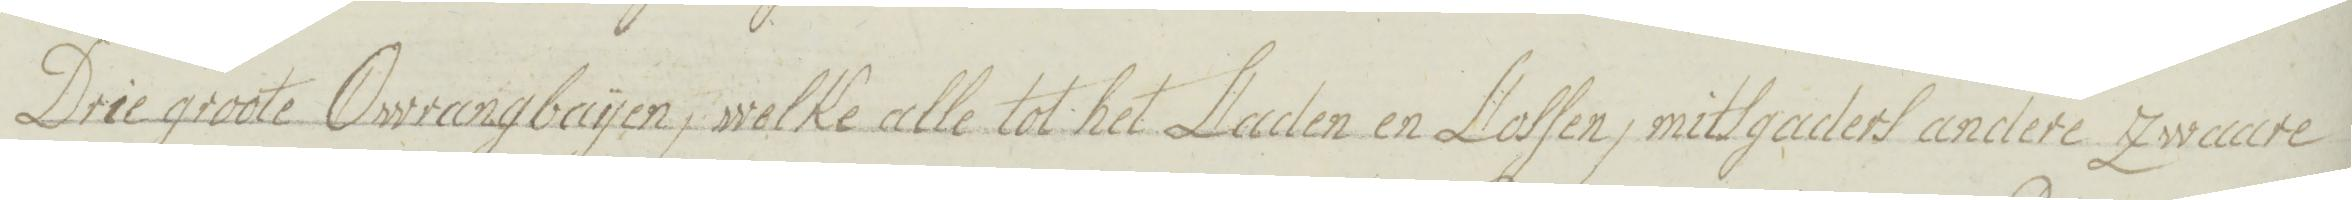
Drie groote Owrangbaijen /:welke alle tot het Laden en Lossen, mitsgaders andere zwaare
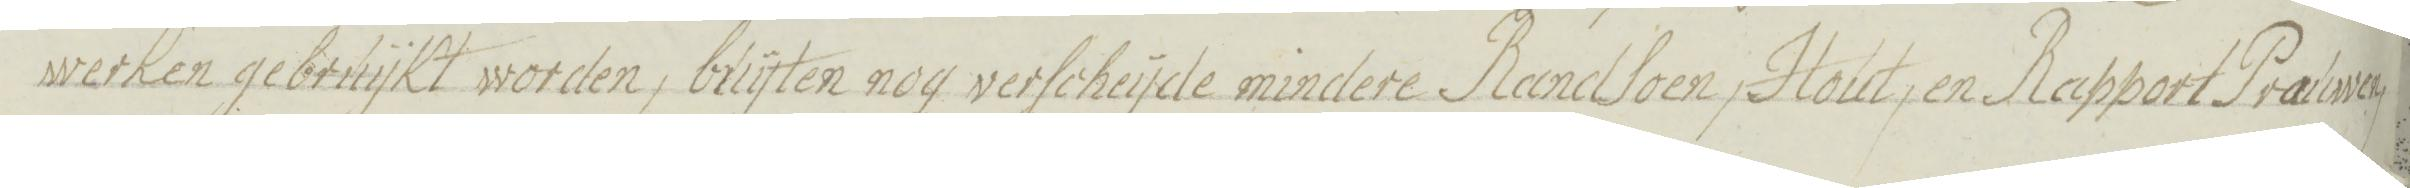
werken gebruijkt worden, buijten nog verscheijde mindere Randsoen, Hout, en Rapport Prauwen.
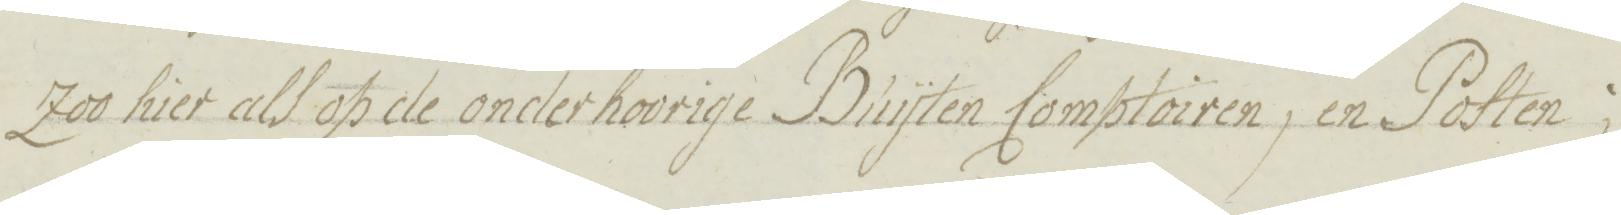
zoo hier als op de onderhoorige Buijten Comptoiren, en Posten
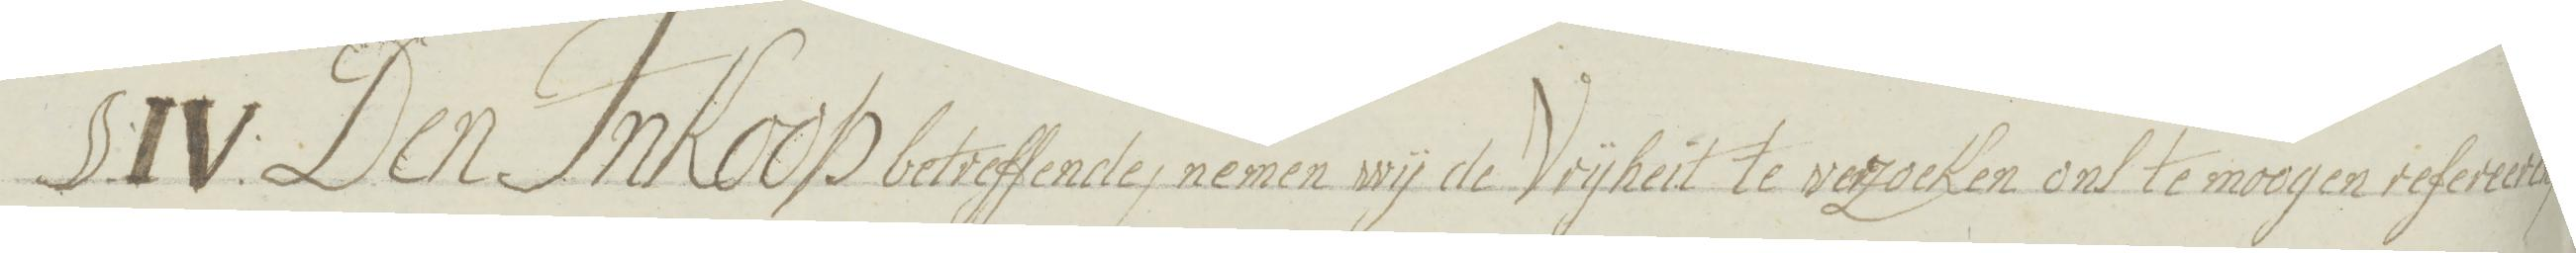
§: IV: Den Inkoop betreffende nemen wij de Vrijheit te verzoeken ons te moogen resereer
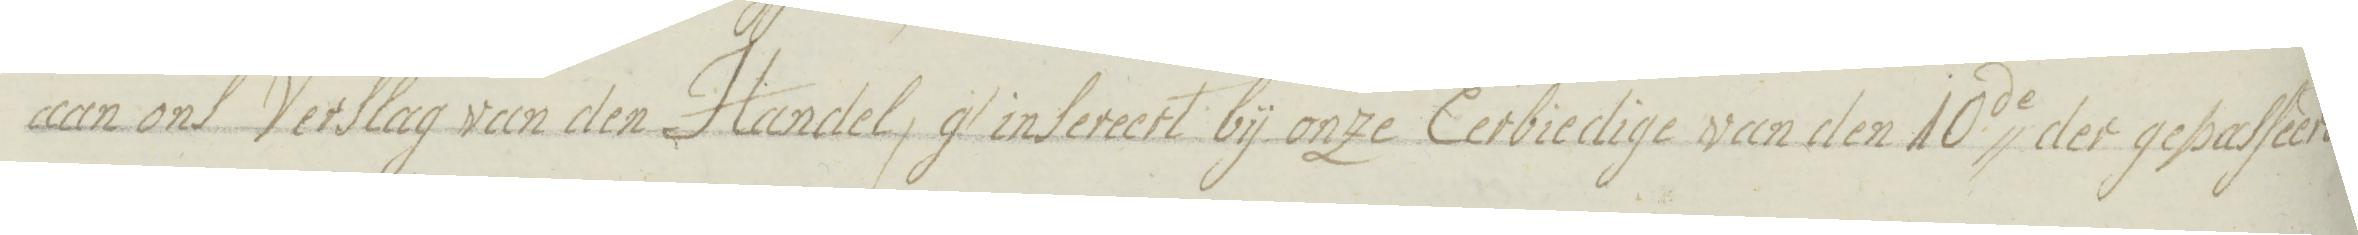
aan ons Verslag van den Handel, g’insereert bij onze Eerbiedige van den 10„de der gepasseerd
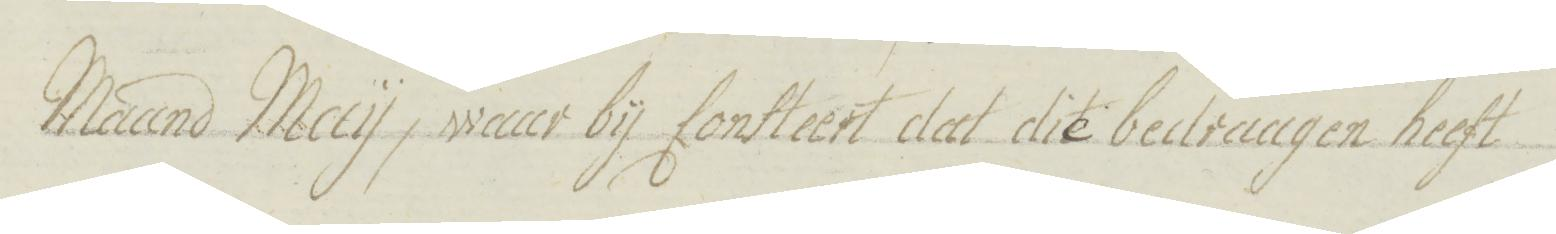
Maand Maij, waar bij Consteert dat die bedraagen heeft
